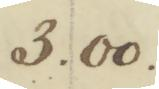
3. 00
